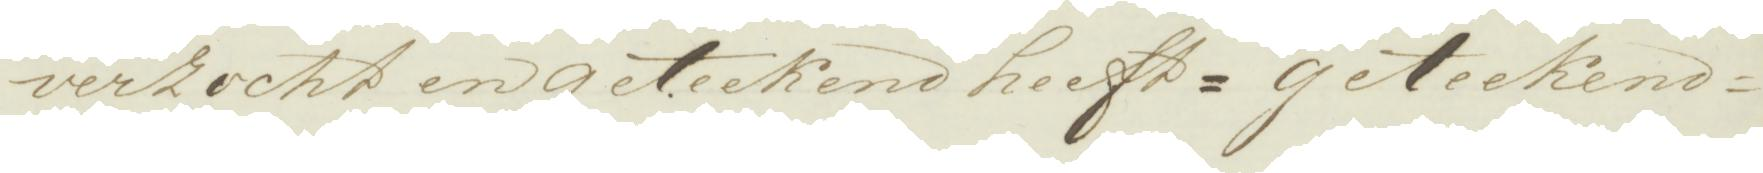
verzocht en geteekend heeft = geteekend =
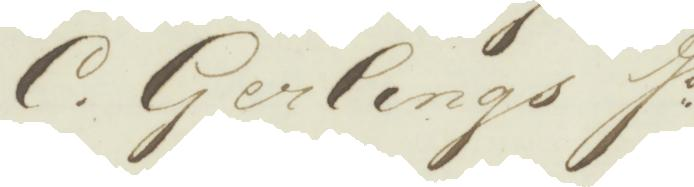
C. Gerlings J„r
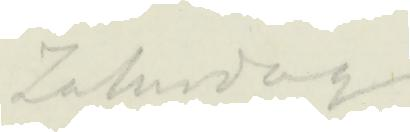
Zaturdag
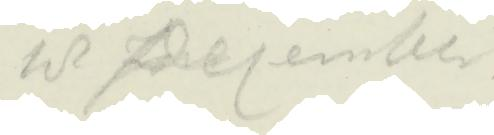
18 December
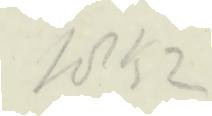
1852
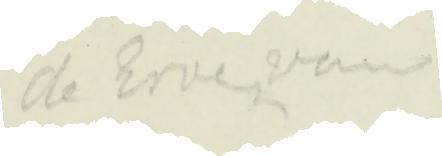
de Erven van
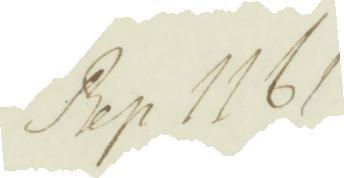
Rep 1161
